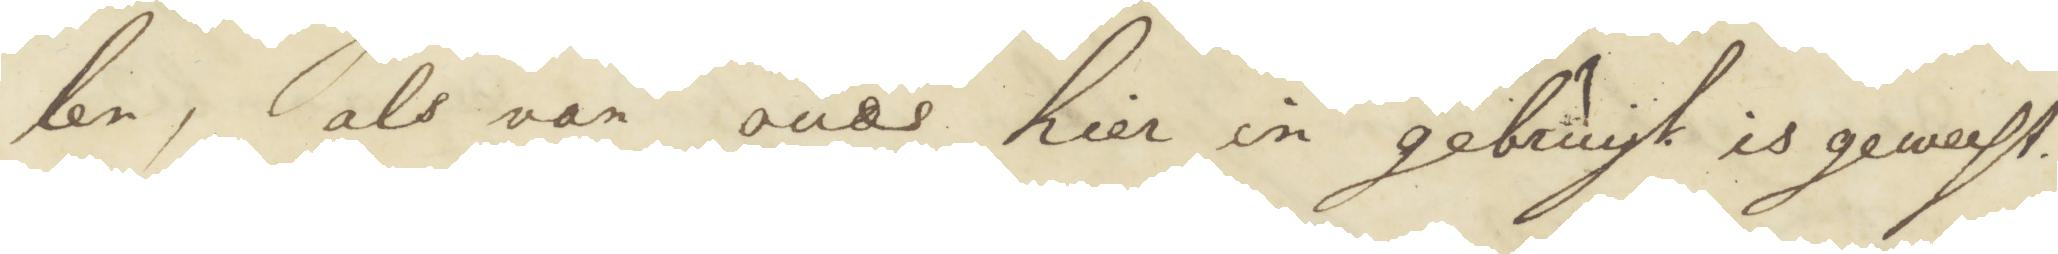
len, als van ouds hier in gebruijk is geweest.
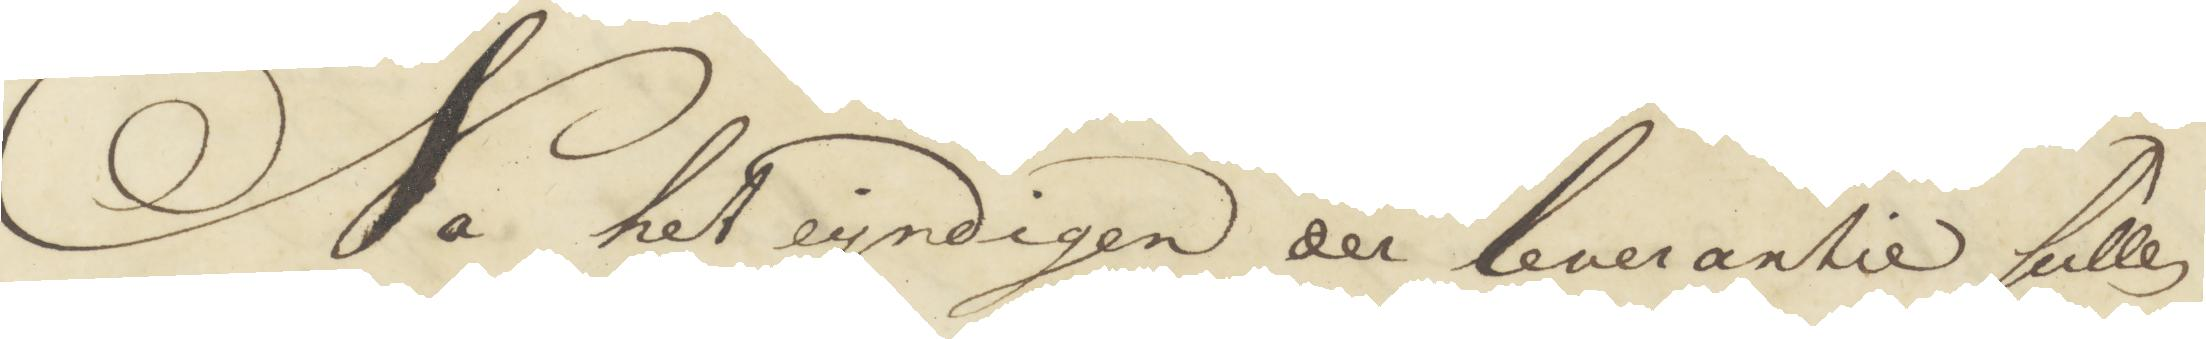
Na het eijndigen der leverantie sullen
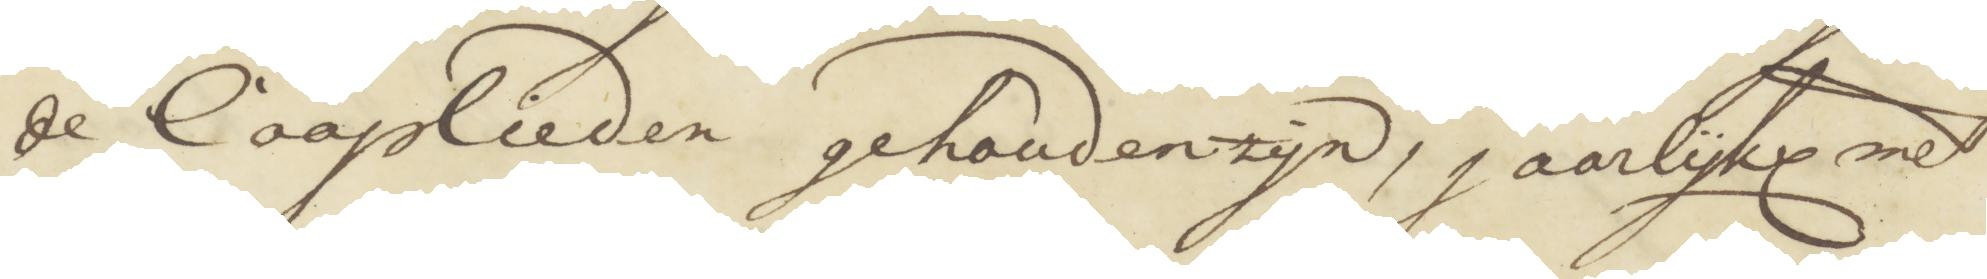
de Cooplieden gehouden zijn, jaarlijkx met
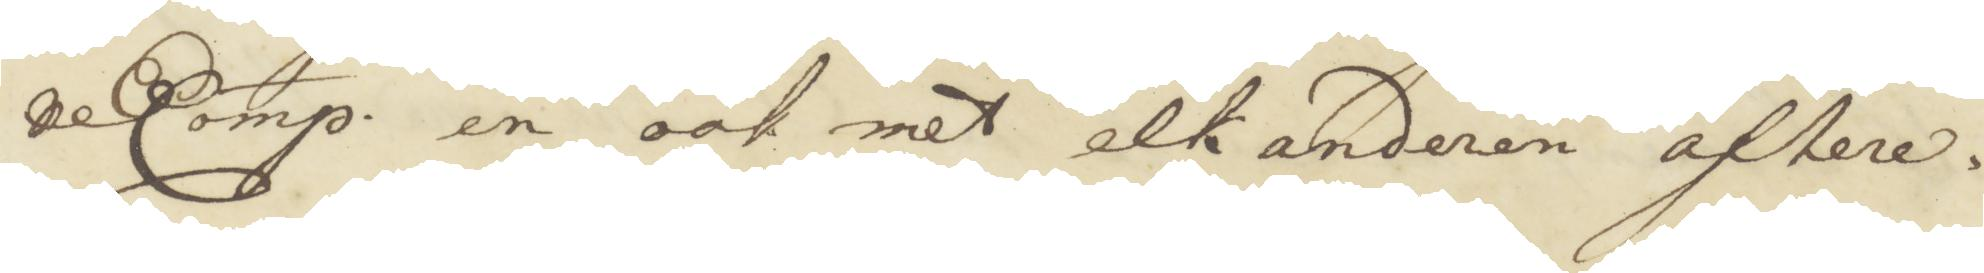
de EComp. en ook met elk anderen aftere
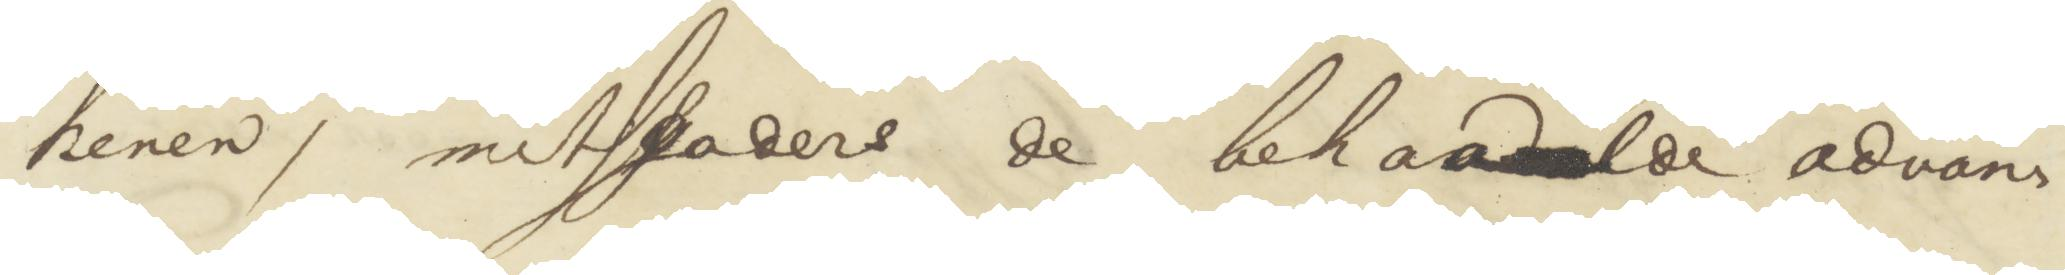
kenen, mitsgaders de behaalde advan
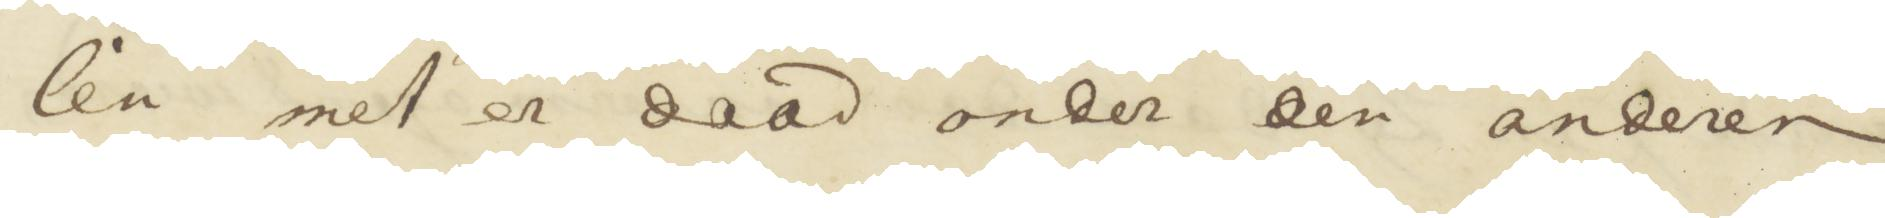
cen met er daad onder den anderen
